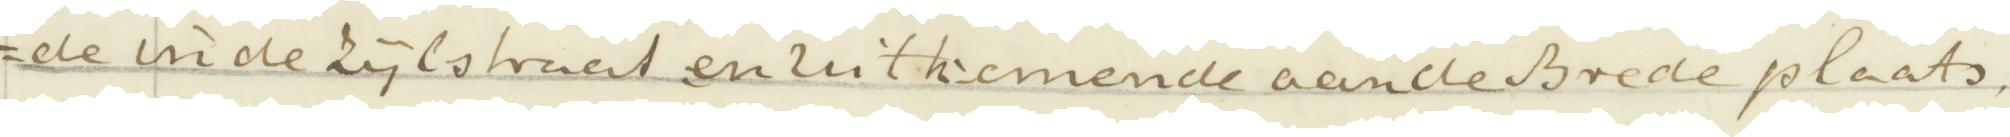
=de in de Zijlstraat en uitkomende aan de Brede plaats,
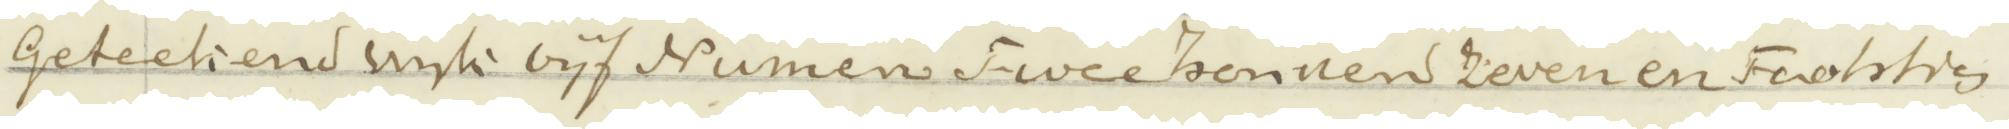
Geteekend wyk vyf Numero Twee Honderd Zeven en Tachtig
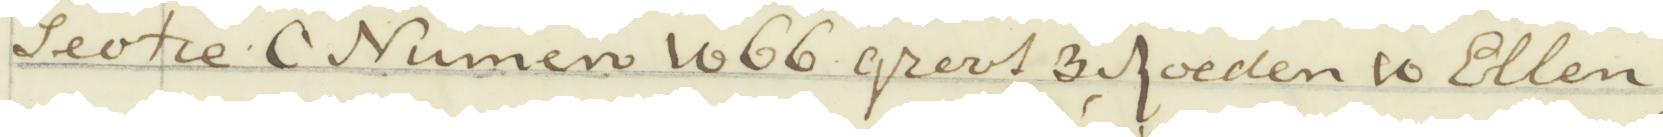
Sectie C Numero 1066 groot 3 Roeden 10 Ellen
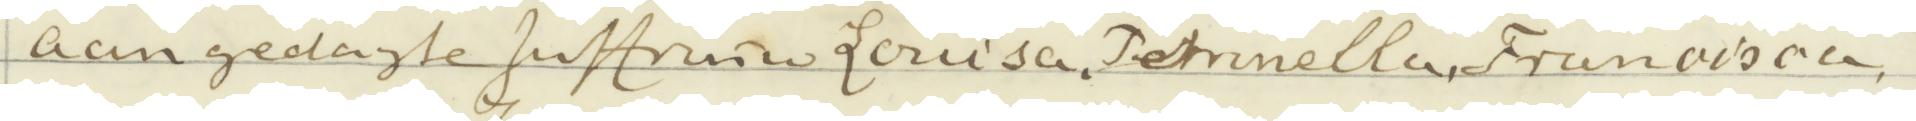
aangedagte Juffrouw Louisa Petronella Francoise,
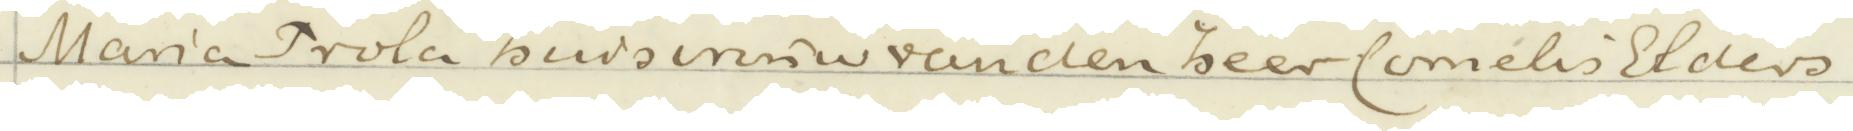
Maria Prola huisvrouw van den heer Cornelis Elders
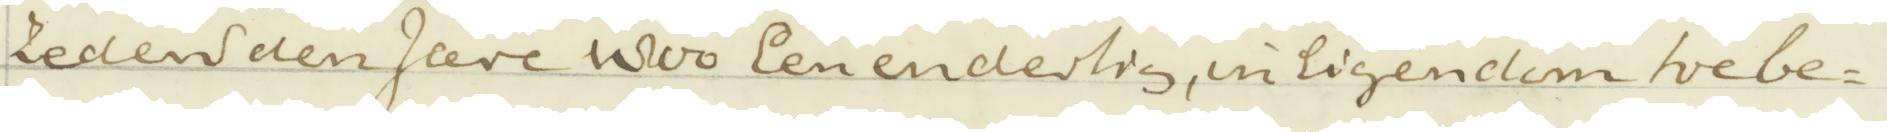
heden den Jare 1800 Een en dertig, in Eigendom toebe=
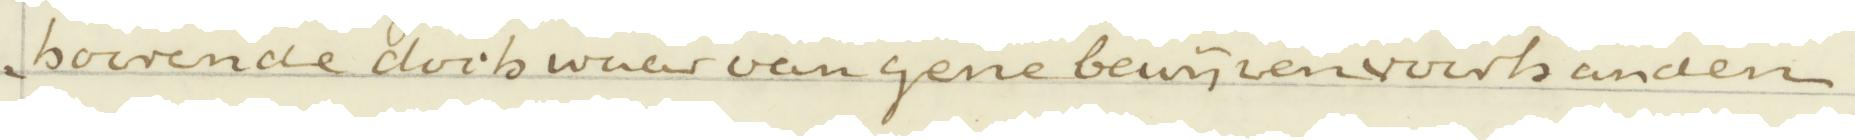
-horende doch waarvan gene bewijzen voorhanden
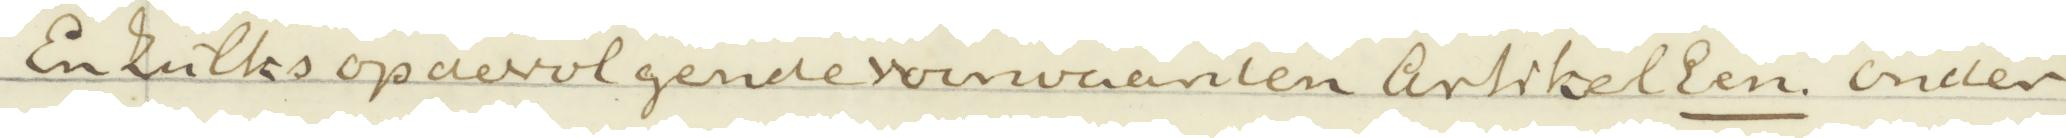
En Zulks op de volgende voorwaarten Artikel Een. onder
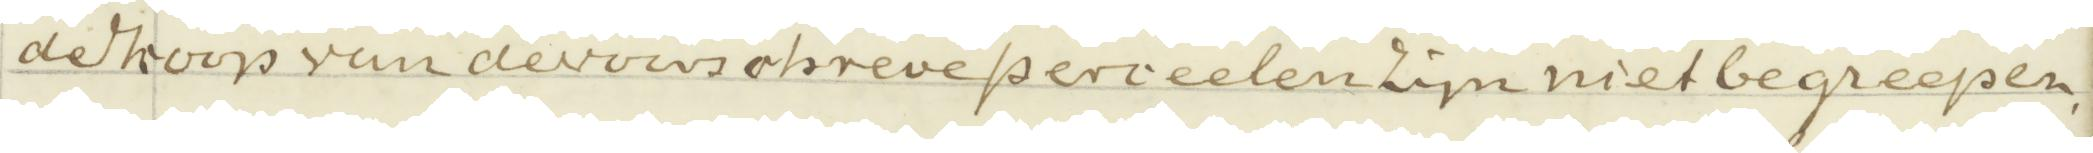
de koop van de voorschreve perceelen Zijn niet begreepen,
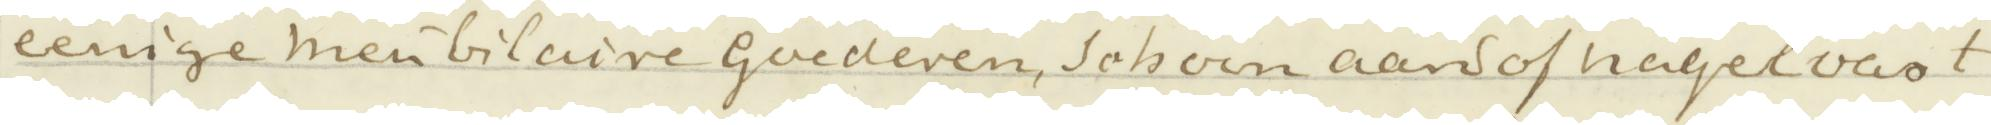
eenige meubilaire Goederen, Schoon aard of nagelvast
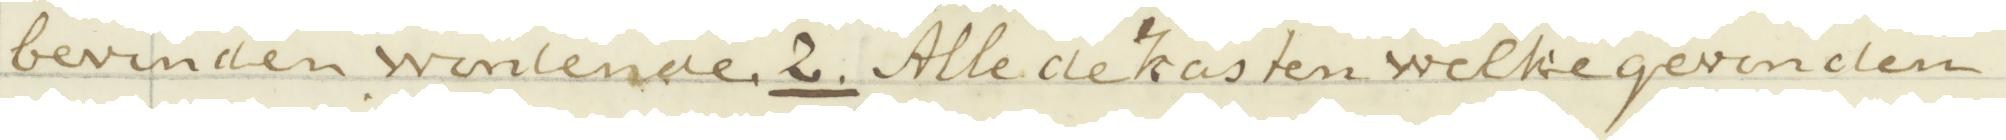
bevonden wordende 2. Alle de kasten welke gevonden
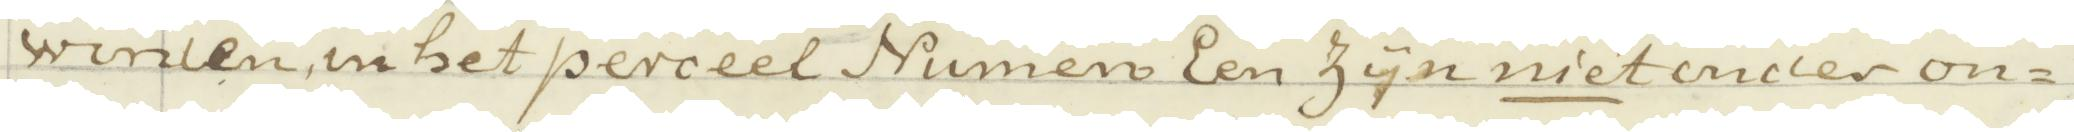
worden, in het perceel Numero Een Zijn niet onder on=
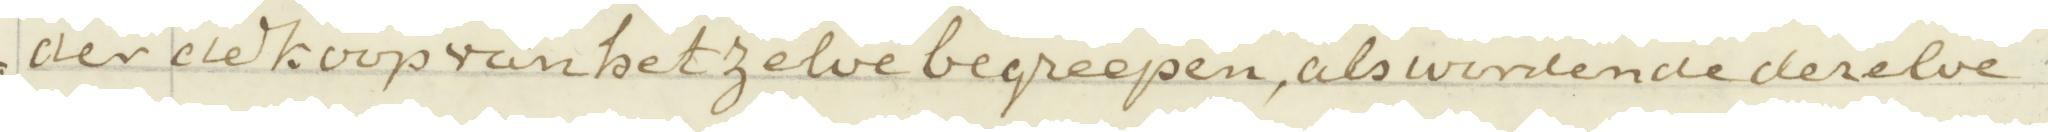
„der de koop van het zelve begreepen, als wordende dezelve
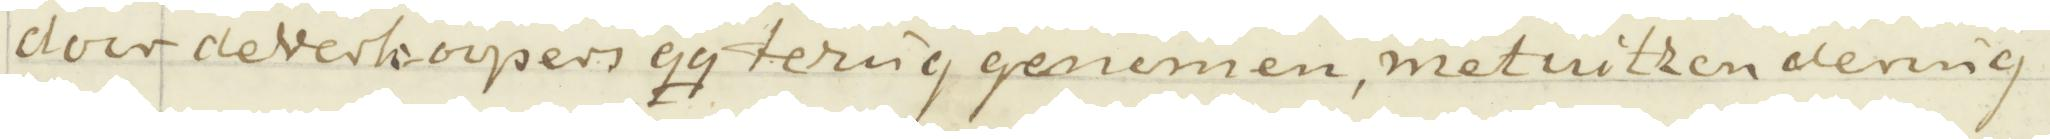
door de verkopers gg terug genomen, met uitzondering
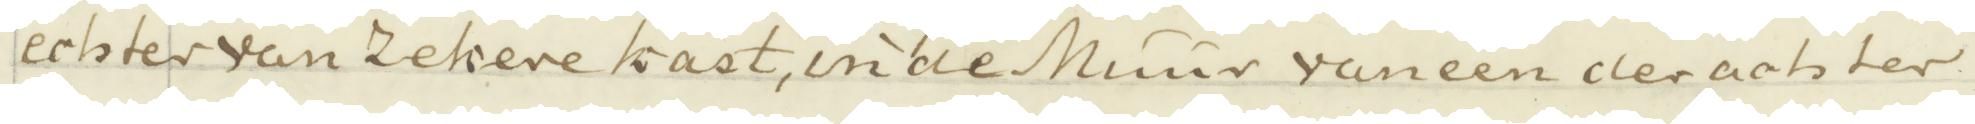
echter van Zekere kast, in de Muur van een der achter
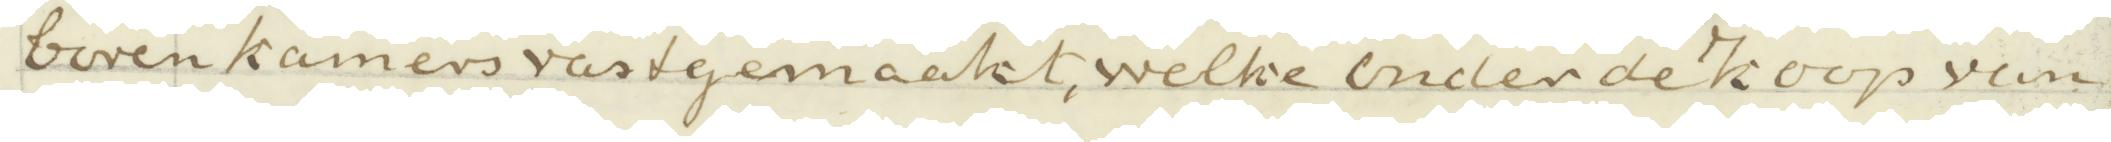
boven kamers vastgemaakt, welke onder de Koop van
